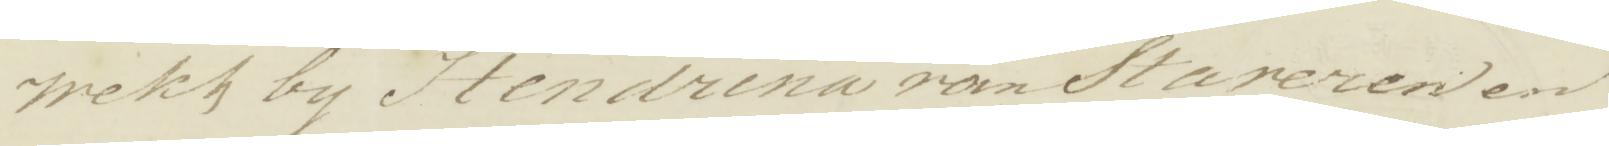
wekt by Hendrina van Staveren en
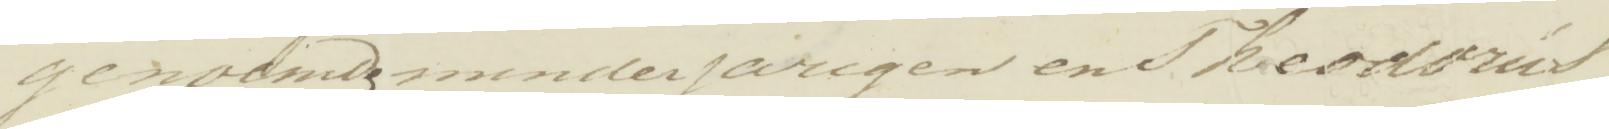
genoemde minderjarigen en Theodorus
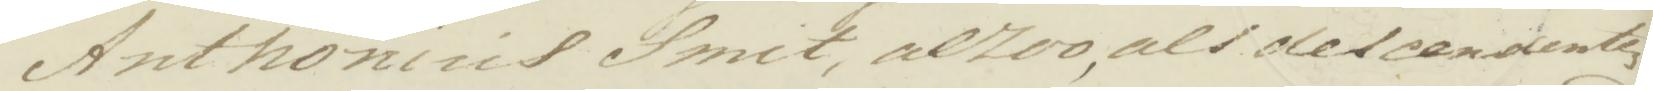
Anthonius Smit, alzoo, als descendenten
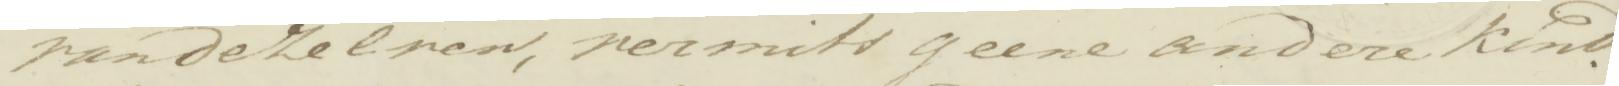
van dezelven, vermits geene andere kind
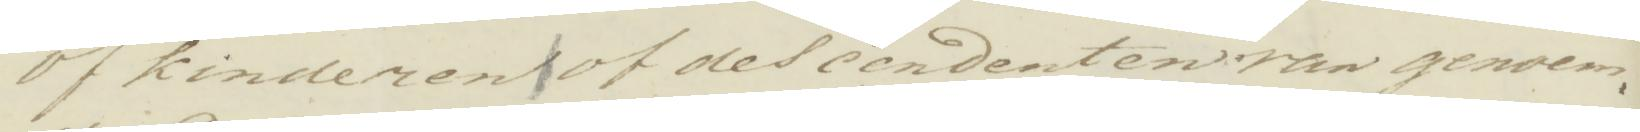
of kinderen of descendenten van genoem„
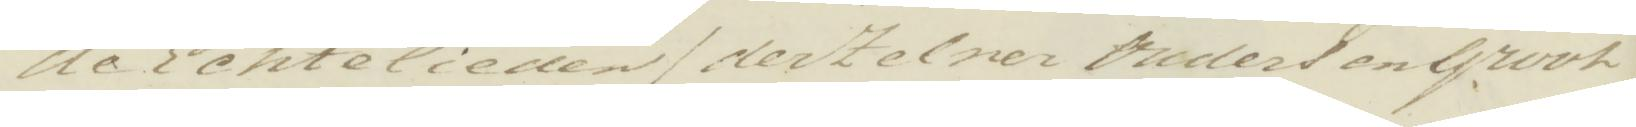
de Echtelieden / derzelver Ouders en Groot
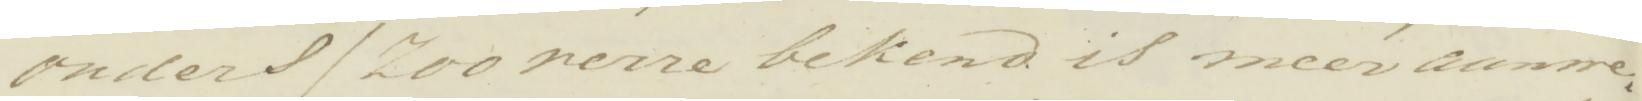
ouders / zoo verre bekend is meer aanwe„
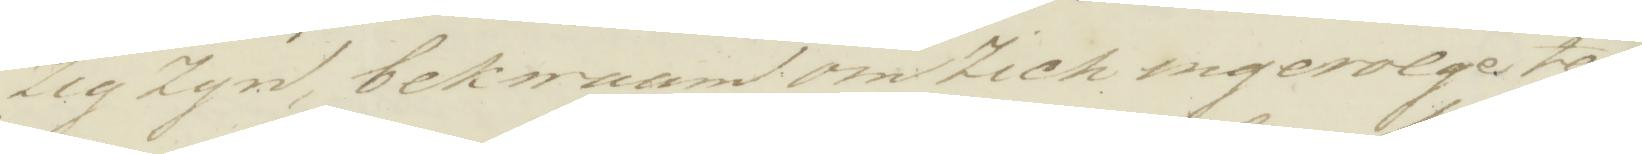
zig zyn, bekwaam om zich ingevolge tes,
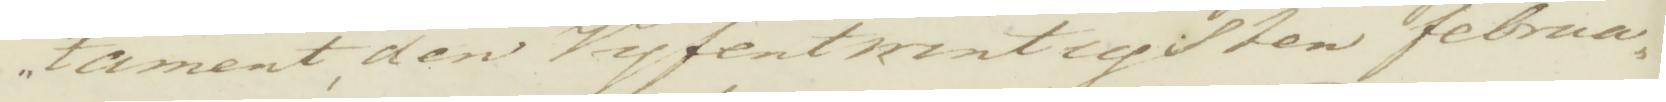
„tament den Vyfentwintigsten februa„
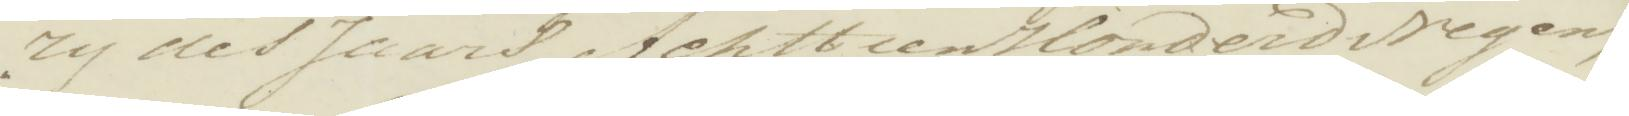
„ry des Jaars Achttien Honderd Negen,
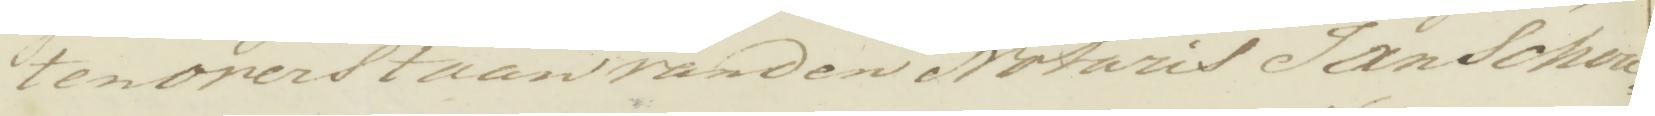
ten overstaan van den Notaris Jan schou„
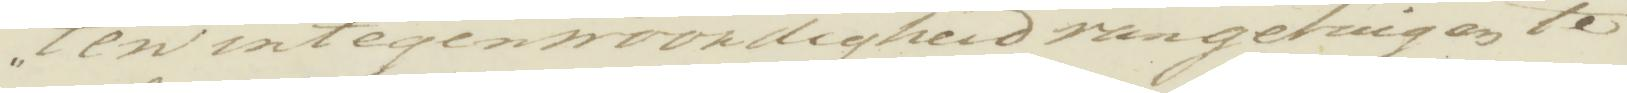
„ten in tegenwoordigheid van getuigen te
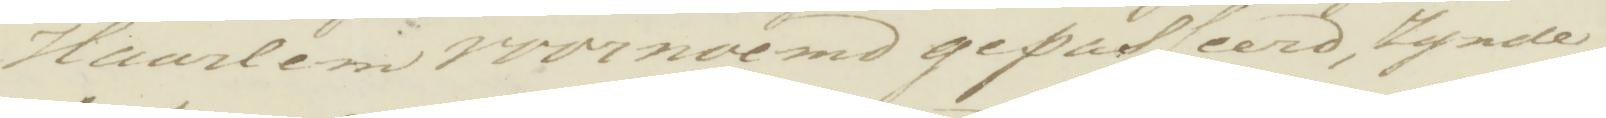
Haarlem voornoemd gepasseerd, zynde
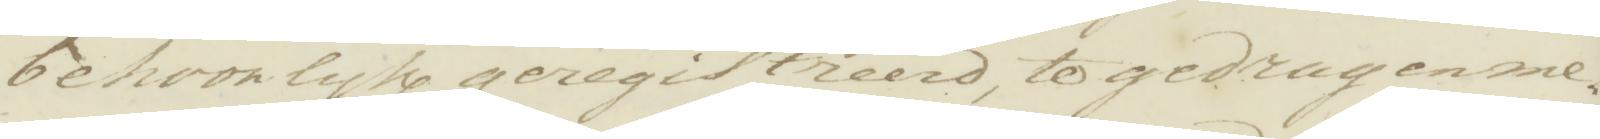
behoorlijk geregistreerd, te gedrag en me„
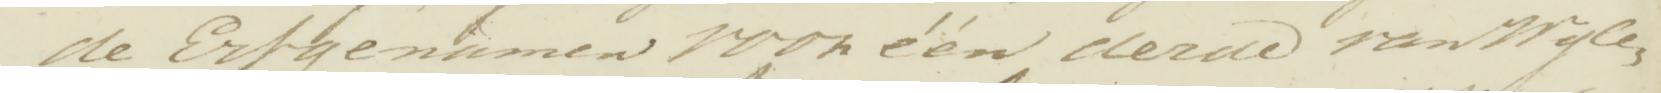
de Erfgenamen voor één derde van Wylen
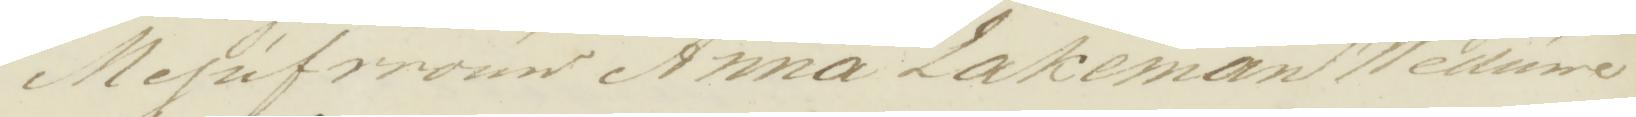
Mejufvrouw Anna Lakeman Weduwe
